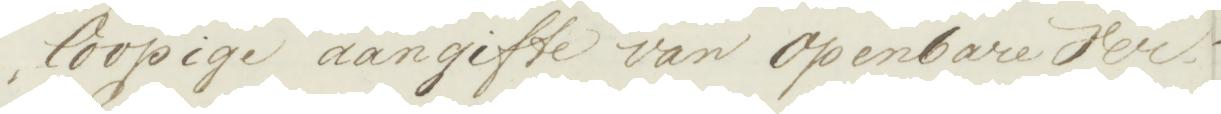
„loopige aangifte van openbare ver
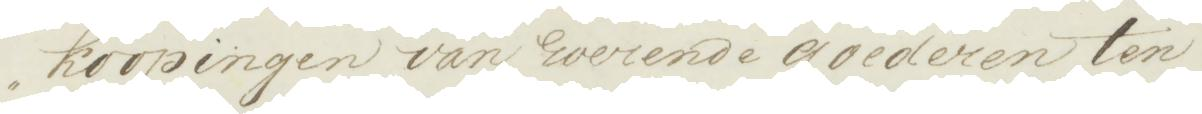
„koopingen van roerende goederen ten
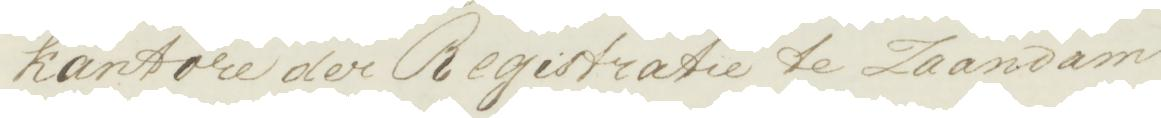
kantore der Registratie te Zaandam
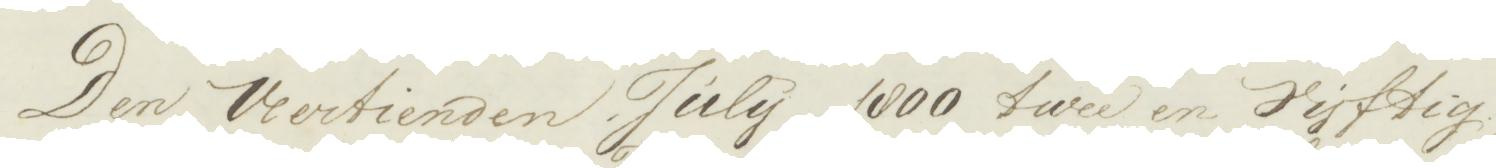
Den Veertienden July 1800 twee en Vijftig
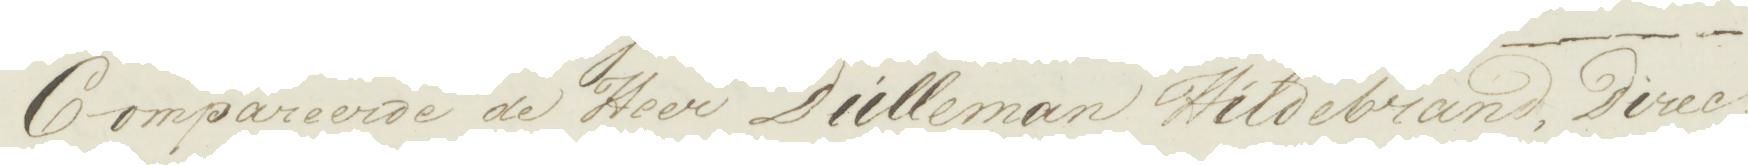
Compareerde de Heer Dulleman Hildebrand, Direc
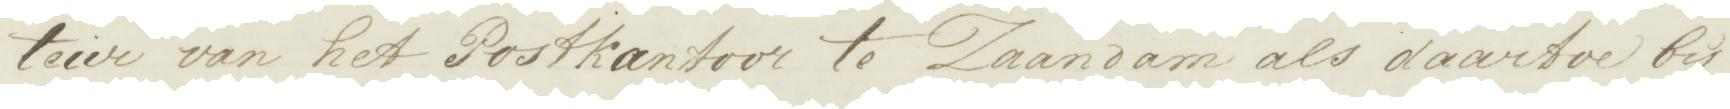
teur van het Postkantoor te Zaandam als daartoe bij
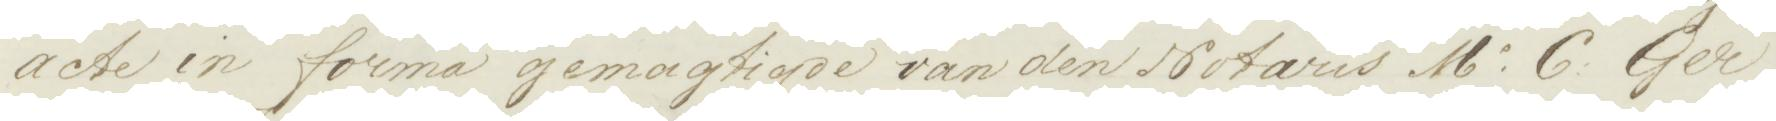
acte in forma gemagtigde van den Notaris M: C: Ger
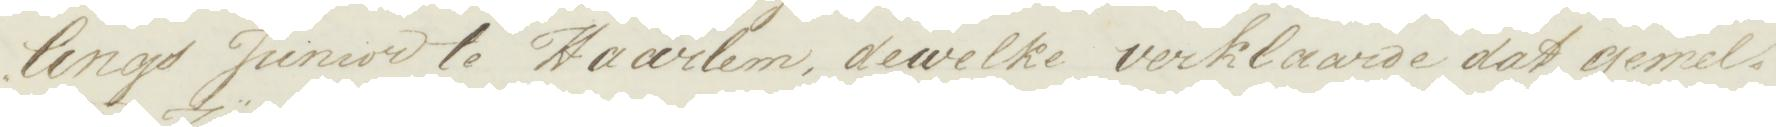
„lings Junior te Haarlem, dewelke verklaarde dat gemel
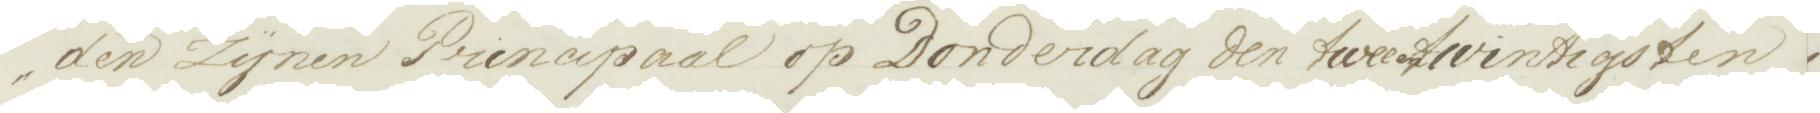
„den zijnen Principaal op Donderdag den twee en twintigsten
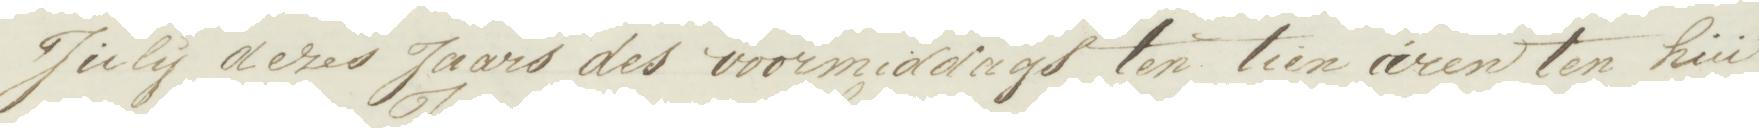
Julij dezes Jaars des voormiddags ten tien uren ten hui
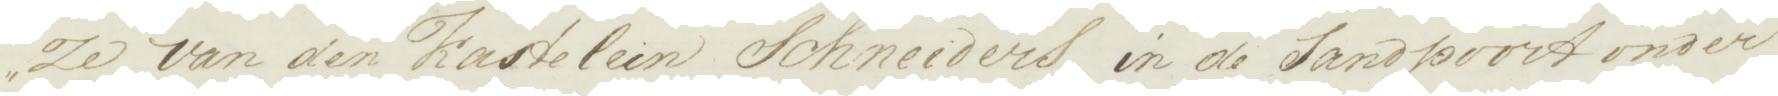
„ze van den Kastelein schneiders in de sandpoort onder
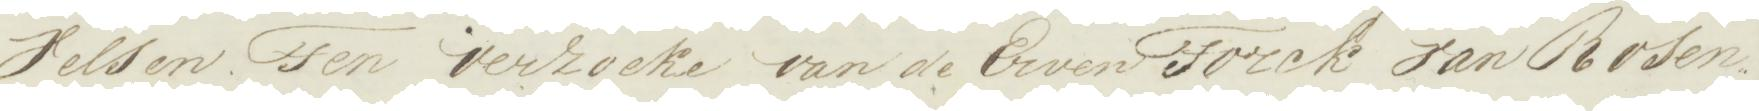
Velsen Ten verzoeke van de Erven Torck van Rosen„
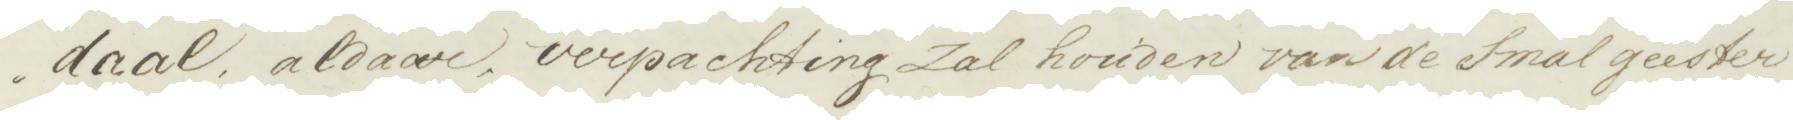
„daal, aldaar, verpachting zal houden van de smal geester
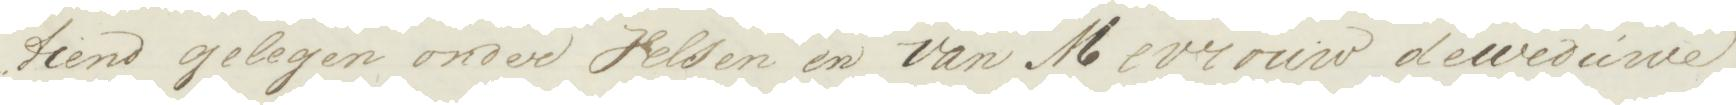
„tiend gelegen onder Velsen en van Mevrouw de weduwe
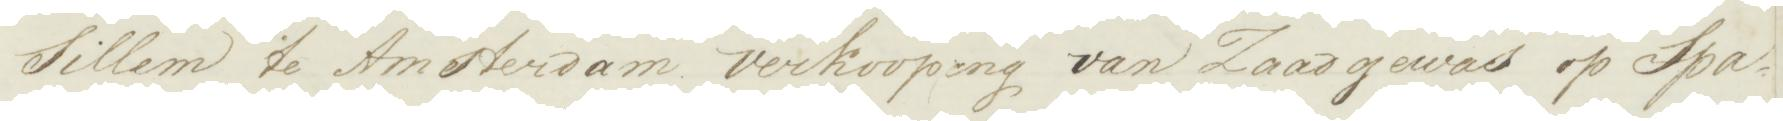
Sillem te Amsterdam verkooping van Zaadgewas op spa„
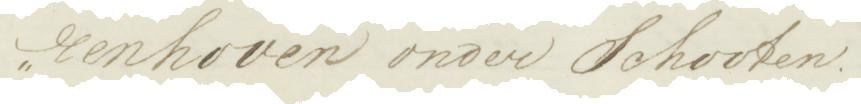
„renhoven onder Schooten.
